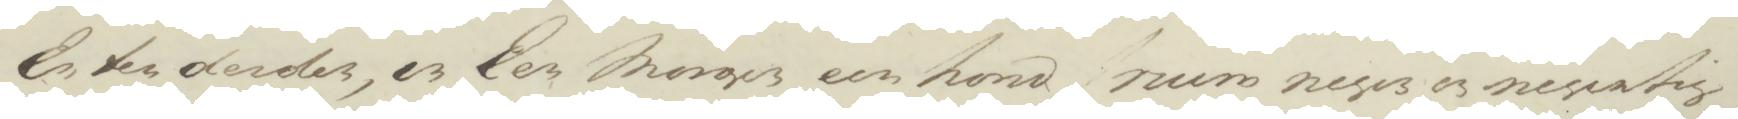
En ten derden, in Een morgen een hond /ruim negen en negentig
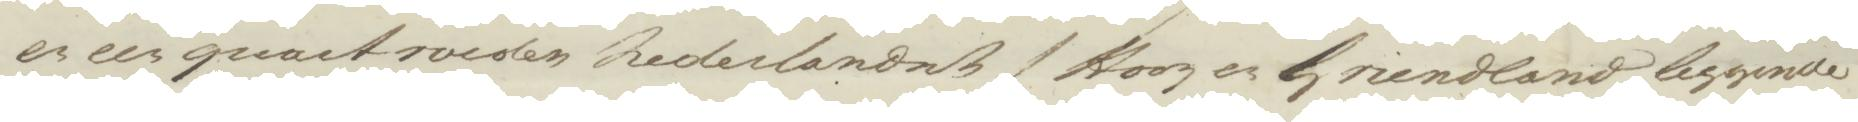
en een quart roeden Nederlandsch / Hooy en Griendland liggende
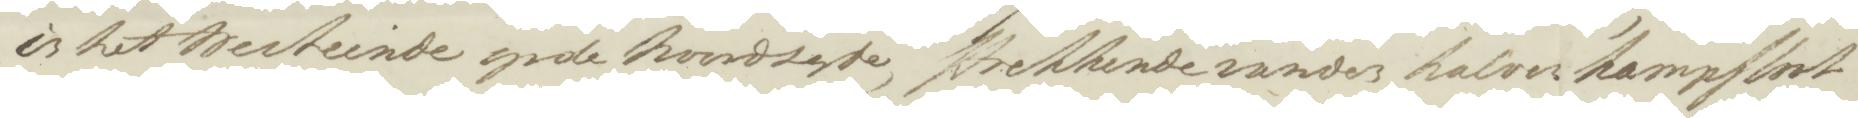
is het Westeinde op de noordzyde, Strekkende van den halven kampsloot
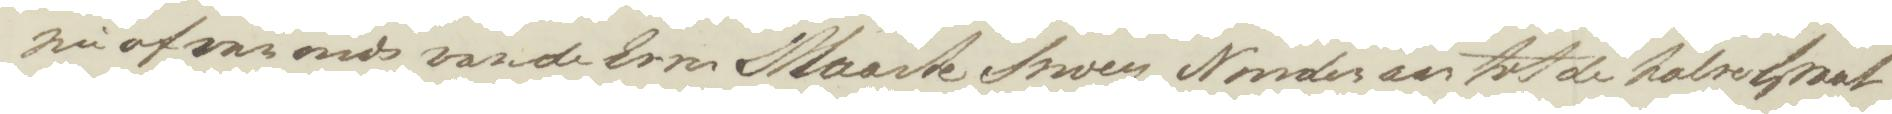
nu of van ouds van de Erven Maarteswey Noorden aan tot de halve Graaf
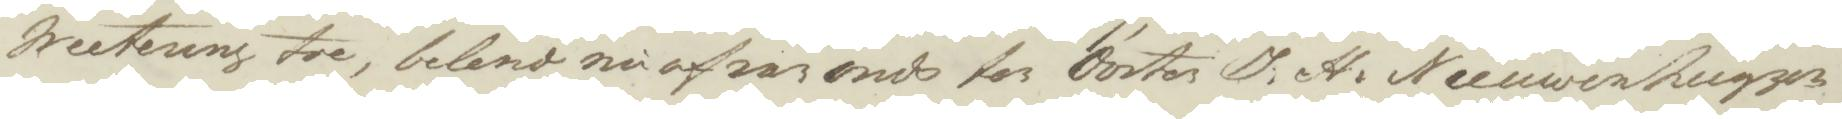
weetering toe, belend nu of van ouds ten Oosten J: H: Nieuwenhuyzen
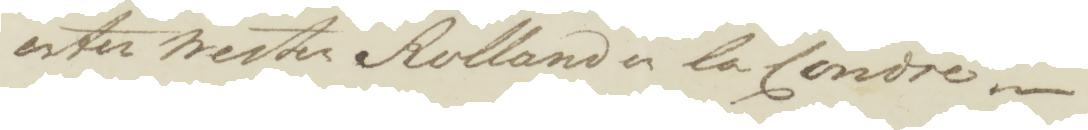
en ten westen Rolland en la Condre
